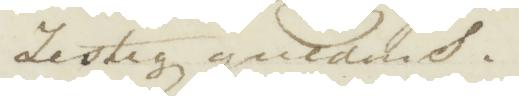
Zestig guldens.
